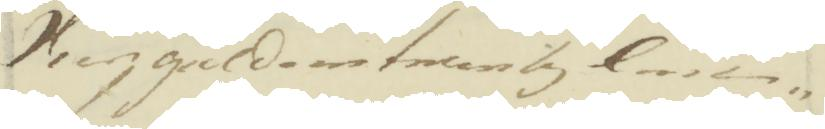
Vier guldens twintig Cent „
